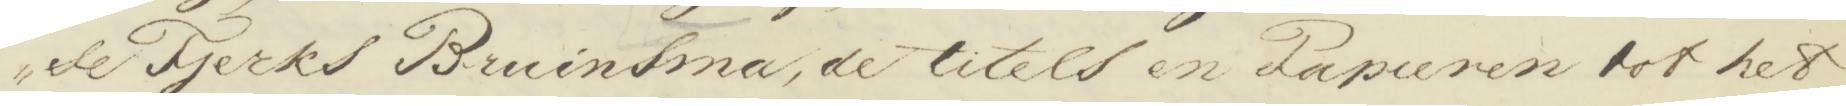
„se Tjerks Bruinsma, de titels en Papieren tot het
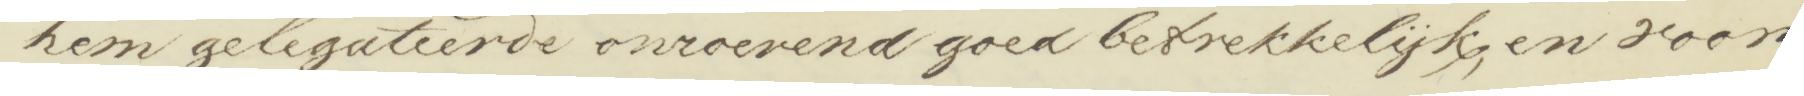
hem gelegateerde onroerend goed betrekkelijk, en voor
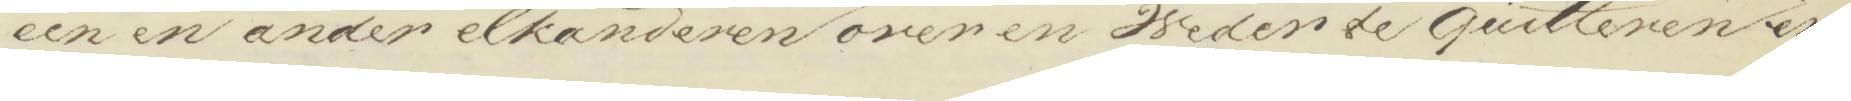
een en ander elkanderen over en weder te quitteren en
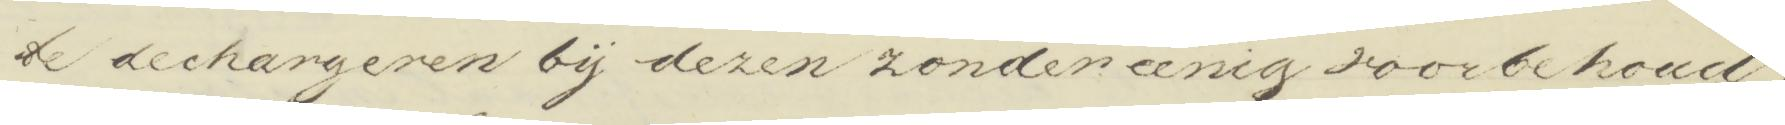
te dechargeren bij dezen zonder eenig voorbehoud
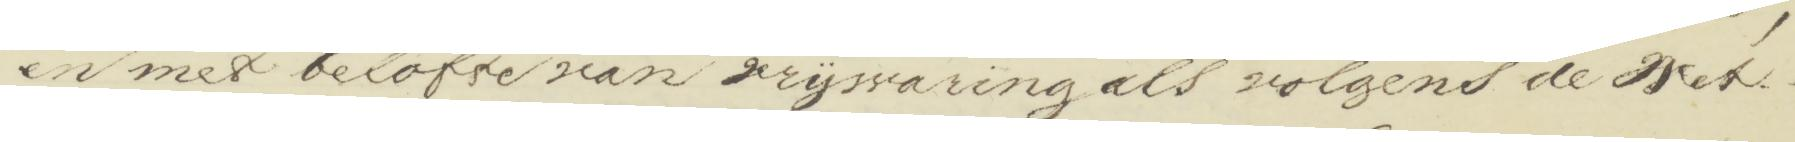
en met belofte van vrijwaring als volgens de Wet
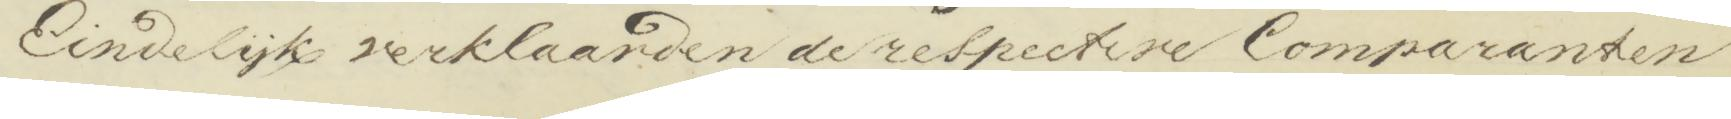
Eindelijk verklaarden de respective Comparanten
